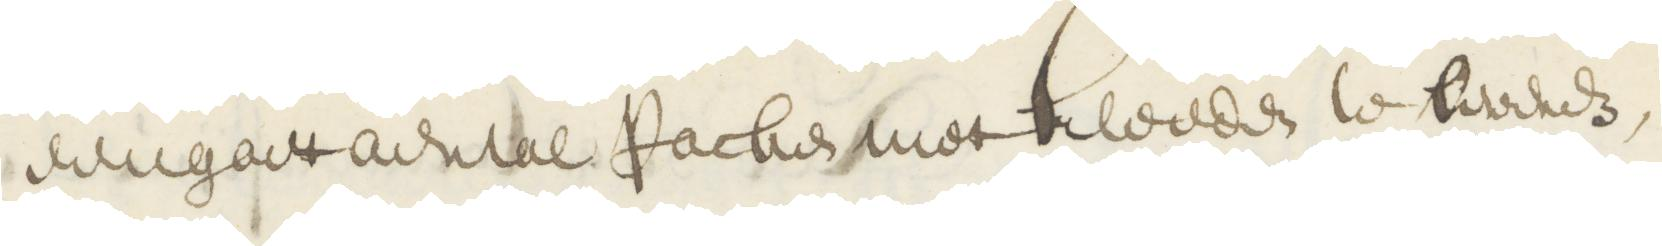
een goet aental packen met kleeden te keeren,
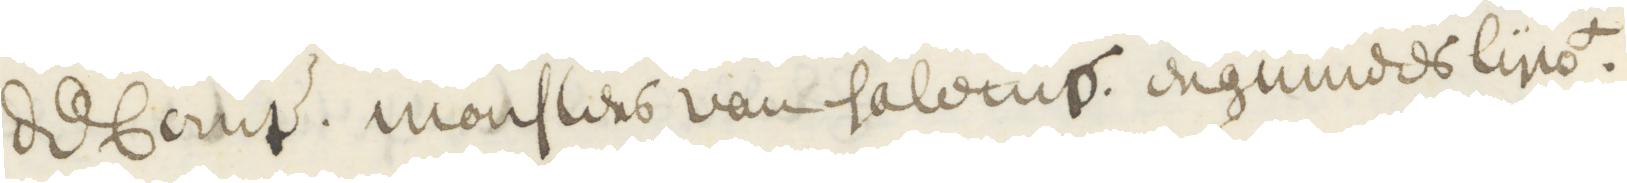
d E Comp. monsters van salemp. enguinees lijw=t
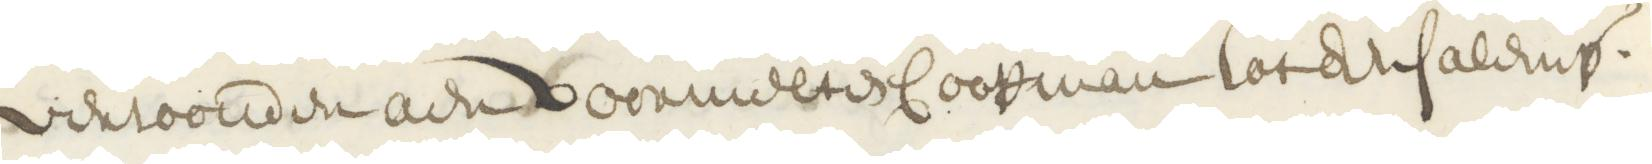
vertoonden aen voormelten Coopman tot densalemp.
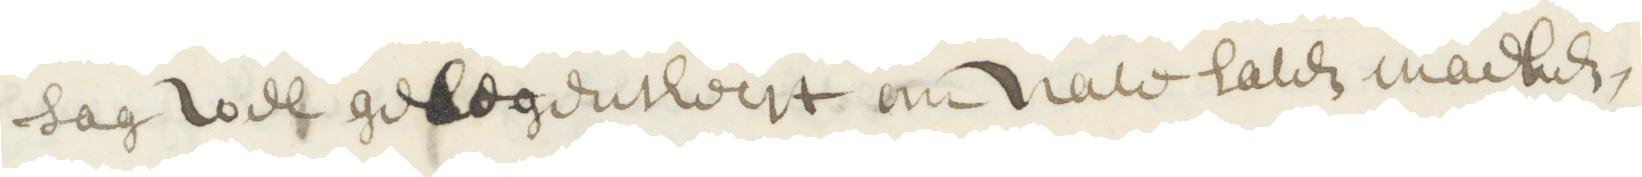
sag wel gelegentheijt om nate laten maeken,
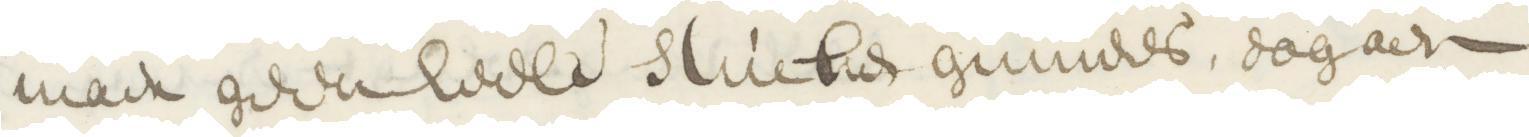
maer geenheele stucken guinees, dog aen
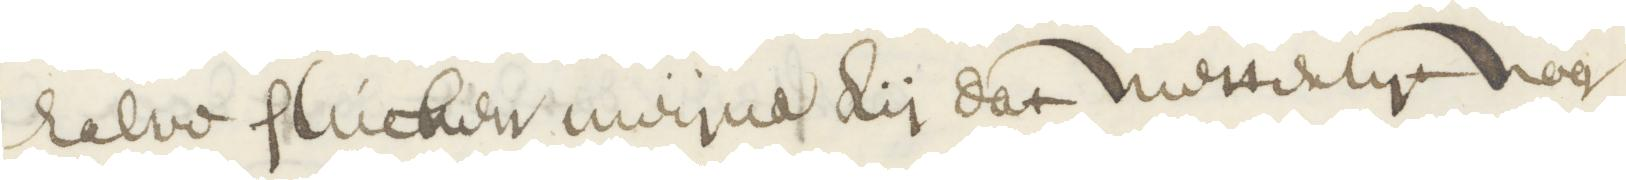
halve stucken meijnde hij dat mettertijt nog
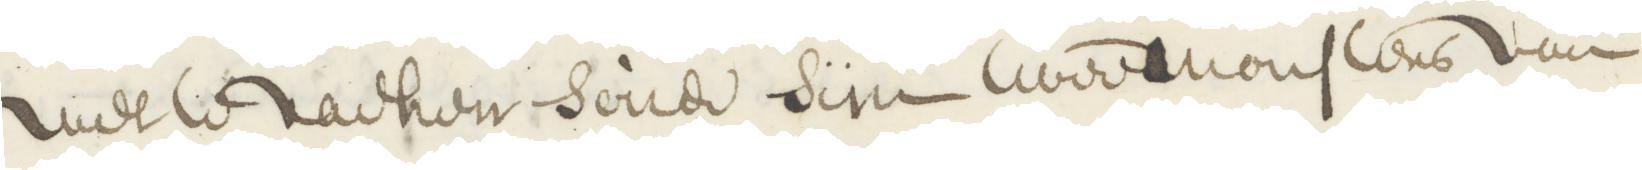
wel te raeken soude sijn tweemonsters van
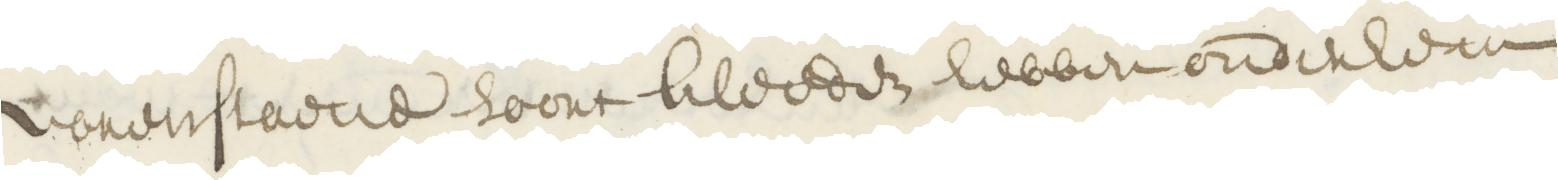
vorenstaende soort kleeden hebben onderhem
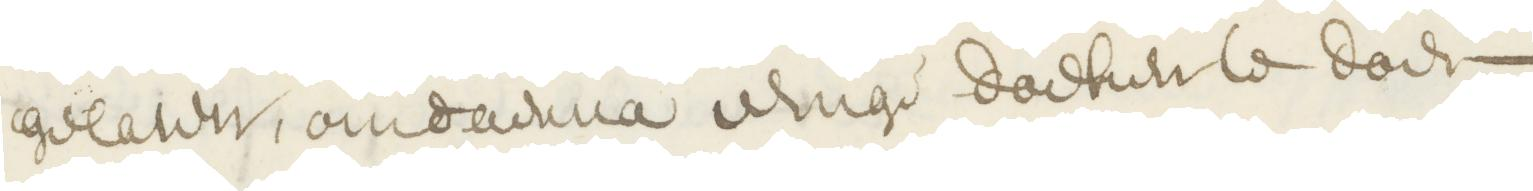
gelaten, om daerna eenige doeken te doen
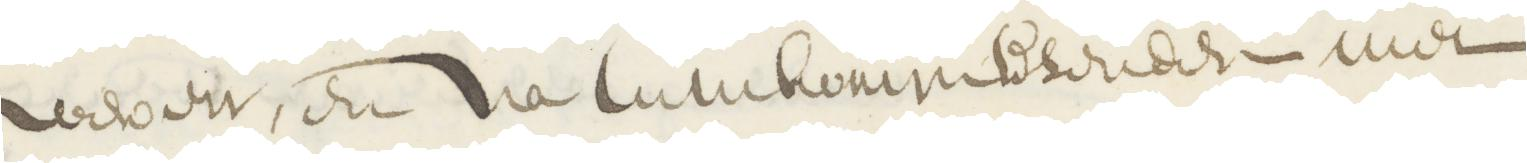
weven, en na tutukorijntesenden met
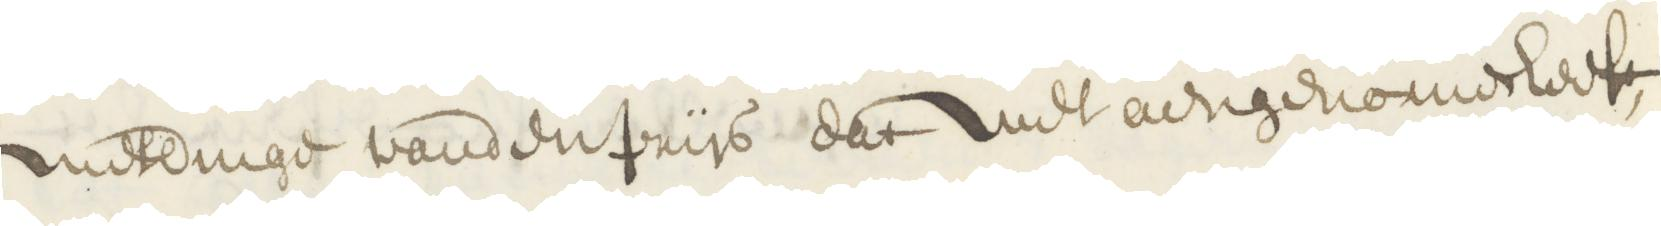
meldinge vandenprijs dat niet aengenomenheeft,
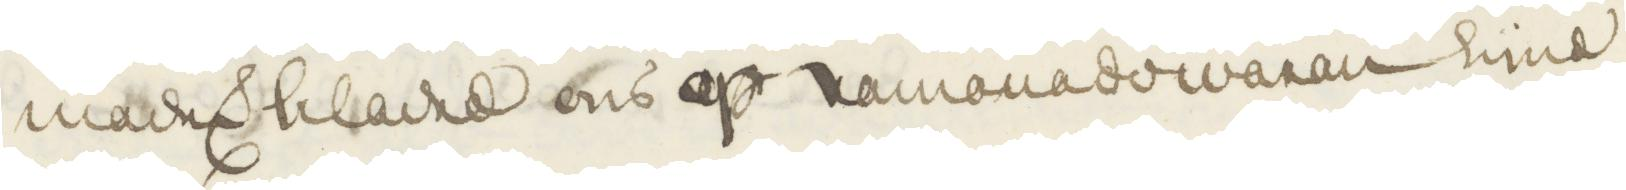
maer verklaerde ons op ramonadewaran sijnde
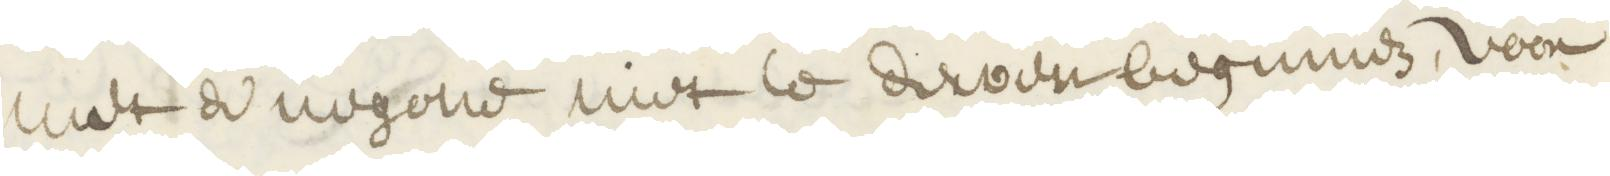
met de negotie niet te durven beginnen, voor
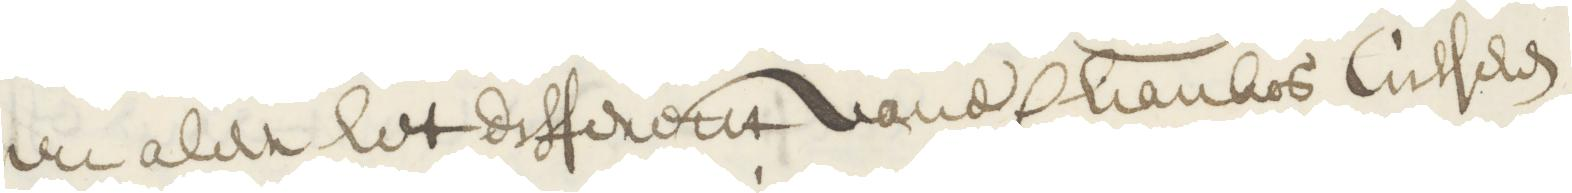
en aleer het different vande Chankos tusschen
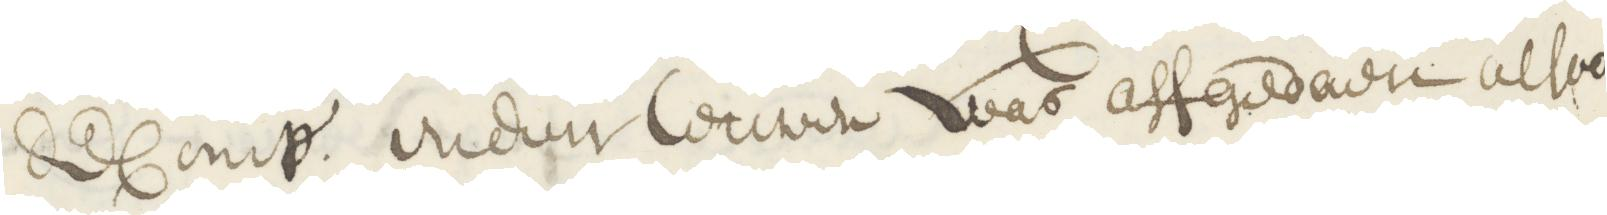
dEComp. enden teuver was affgedaen alsoo
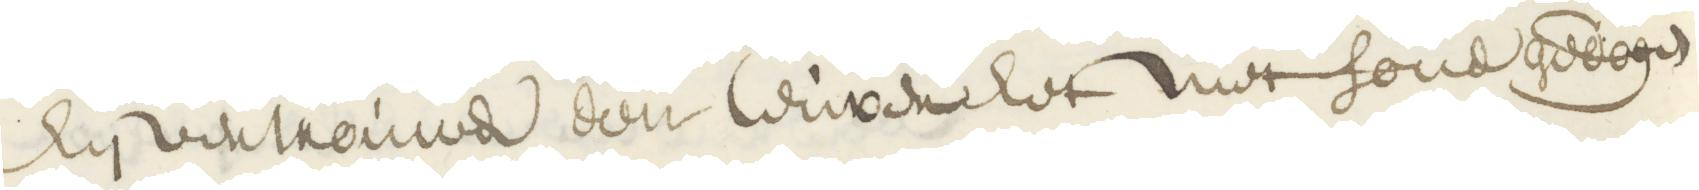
hij vertrouwde den teuver het niet soude gedogen
